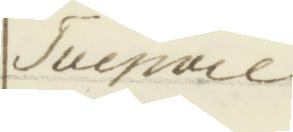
Toepoel
